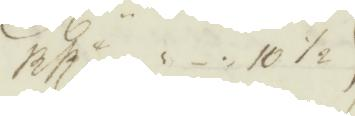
13 pCt . . „ - „ 10½
